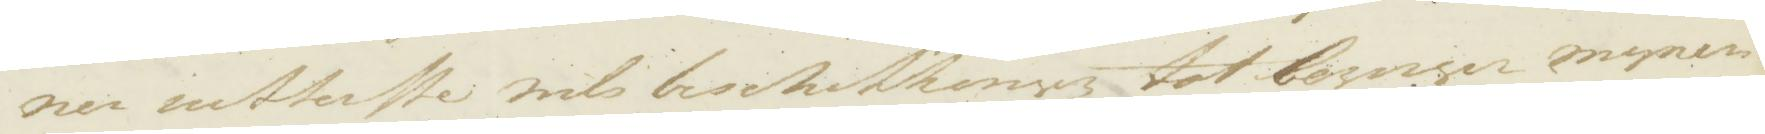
nen uitterste wils beschikking en tot bezorger mynen
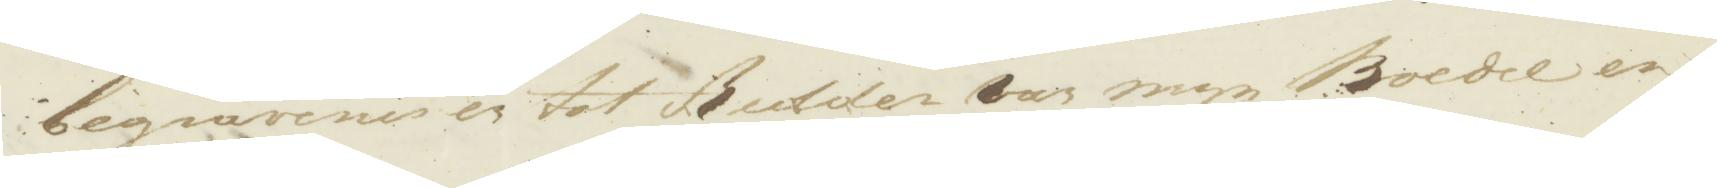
begravenis en tot Redder van myn Boedel en
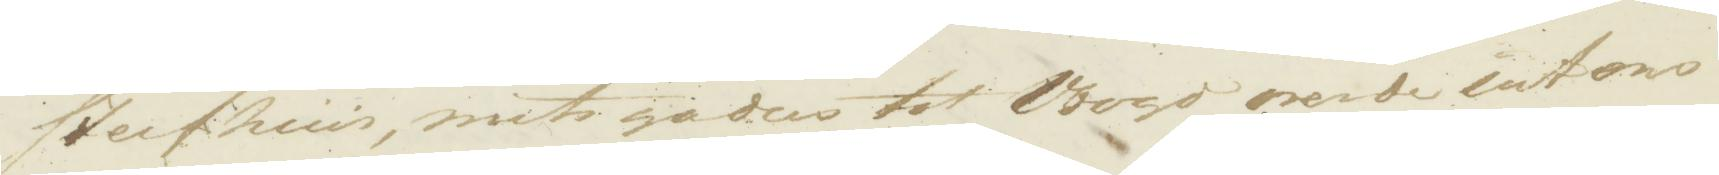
sterfhuis, mitsgaders tot Voogd over de uit ons
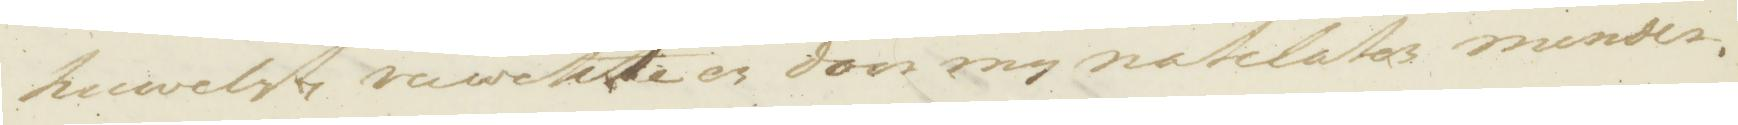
huwelyk verwekte en door my natelaten minder,
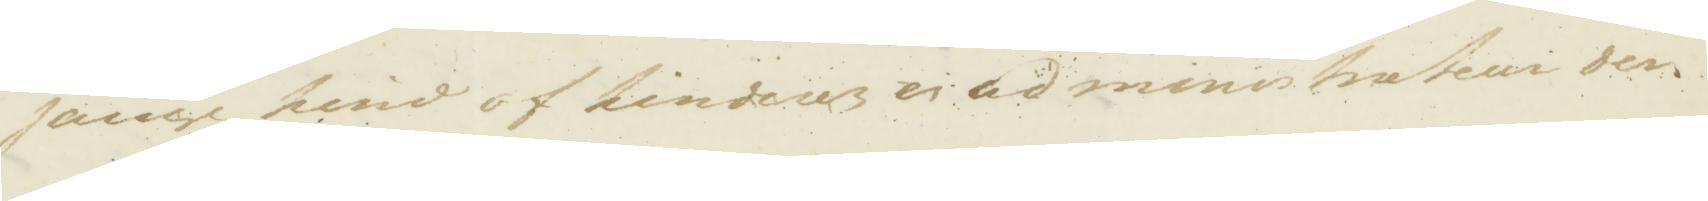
jarige kind of kinderen en administrateur der,
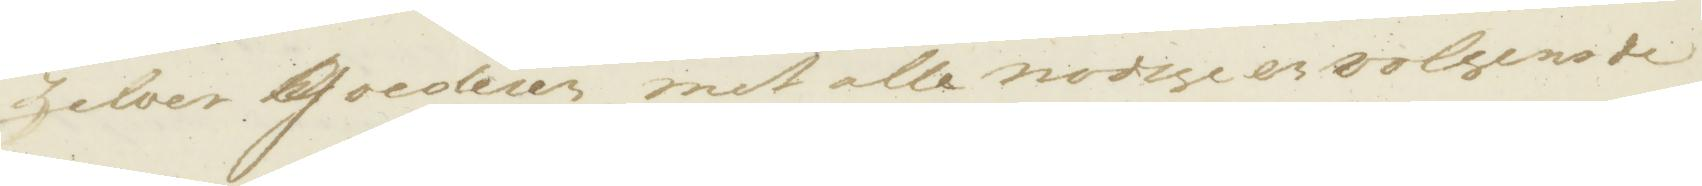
zelver Goederen, met alle nodige en volgens de
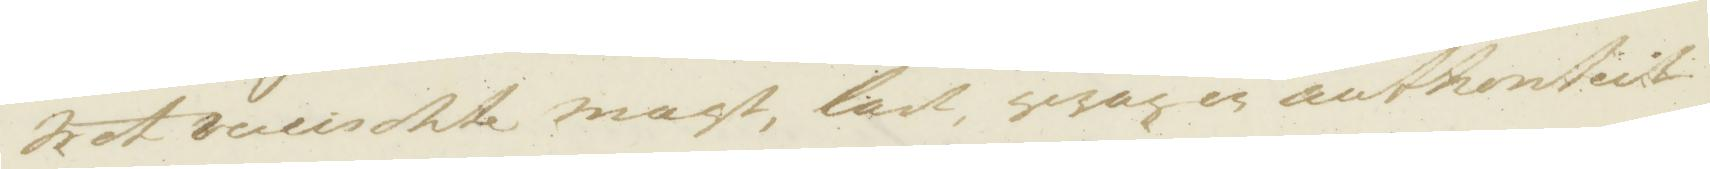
wet vereischte magt, last, gezag en authoriteit
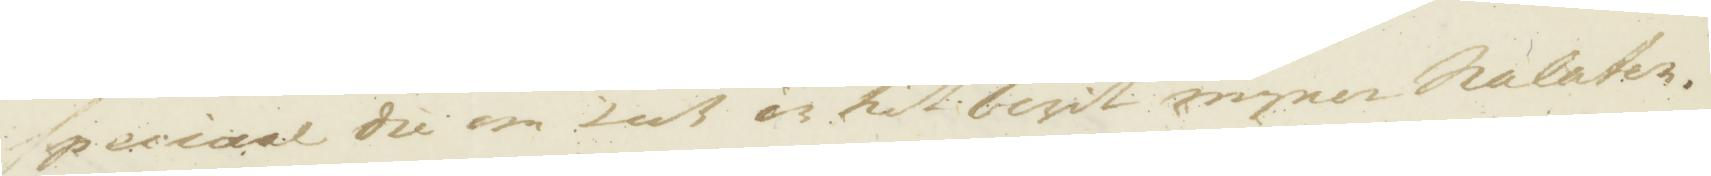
speciaal die om zich in het bezit van myner nalaten,
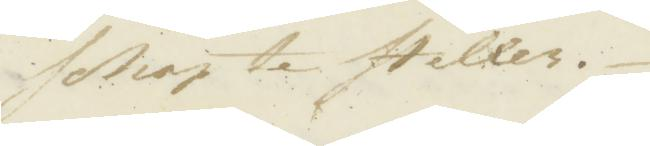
schap te stellen.
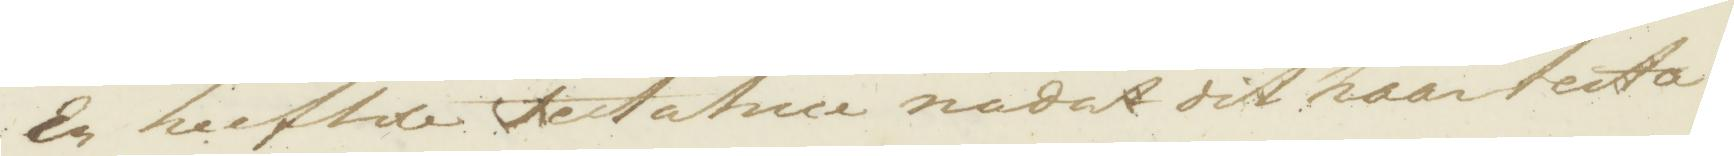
En heeft de Testatrice nadat dit haar testa,
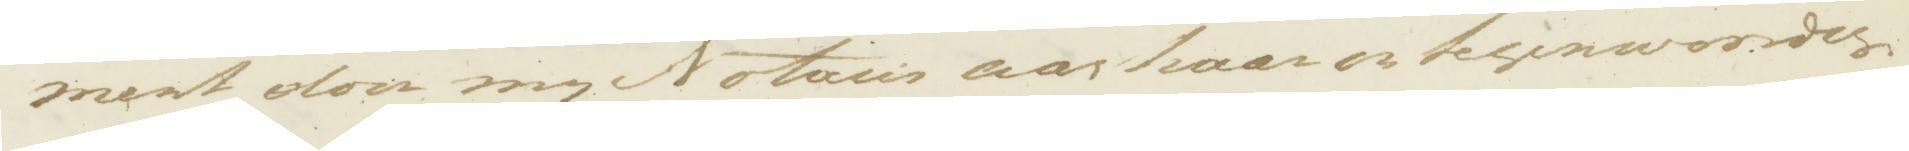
ment door my Notaris aan haar in tegenwoordig
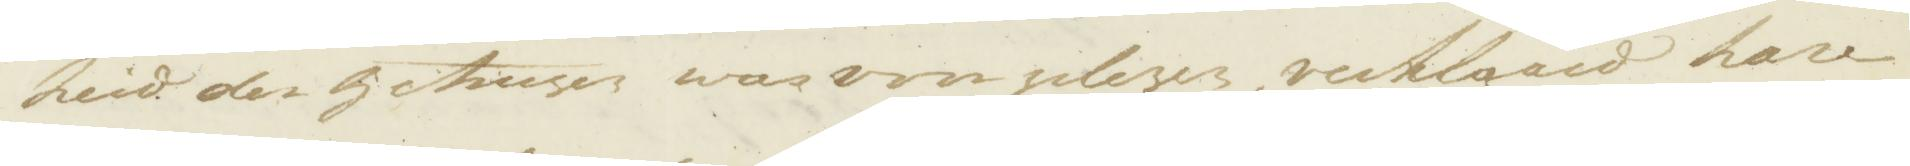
heid der getuigen was voorgelezen, verklaarde hare
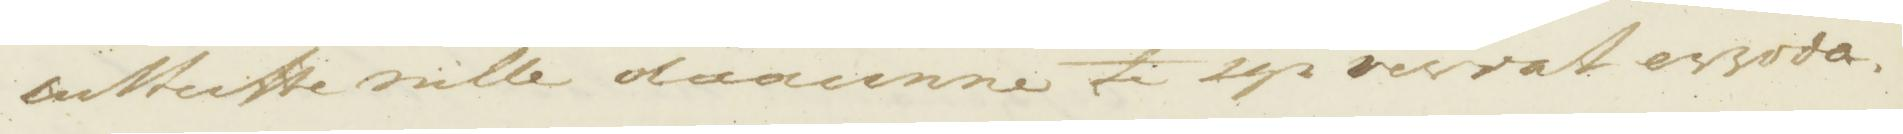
uitterste wille daarinne te zyn vervat en zoda,
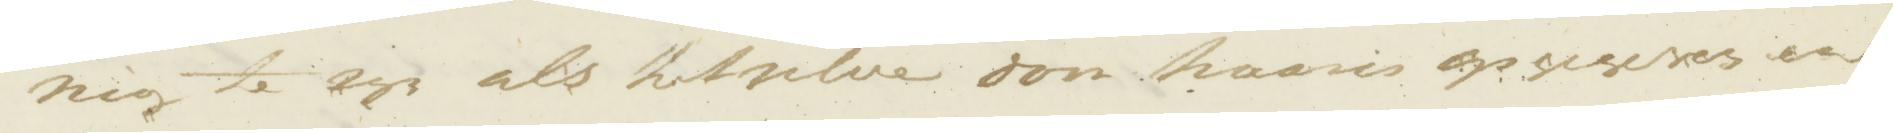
nig te zijn als hetzelve door haar is opgeschreven en
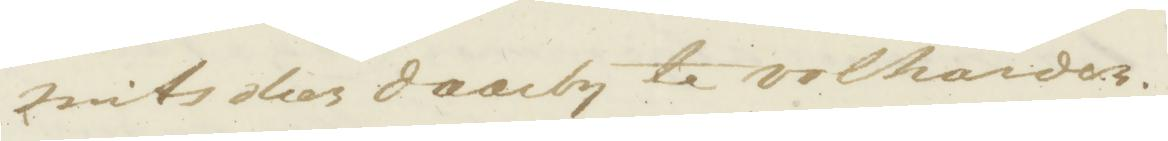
mitsdien daarby te volharden.
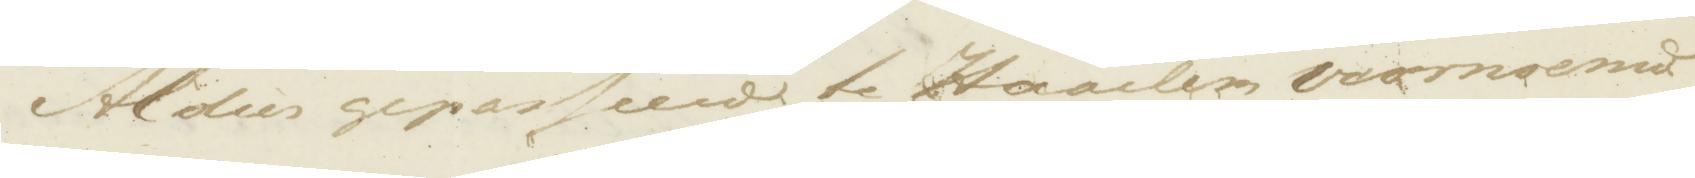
Aldus gepasseerd te Haarlem voornoemd
